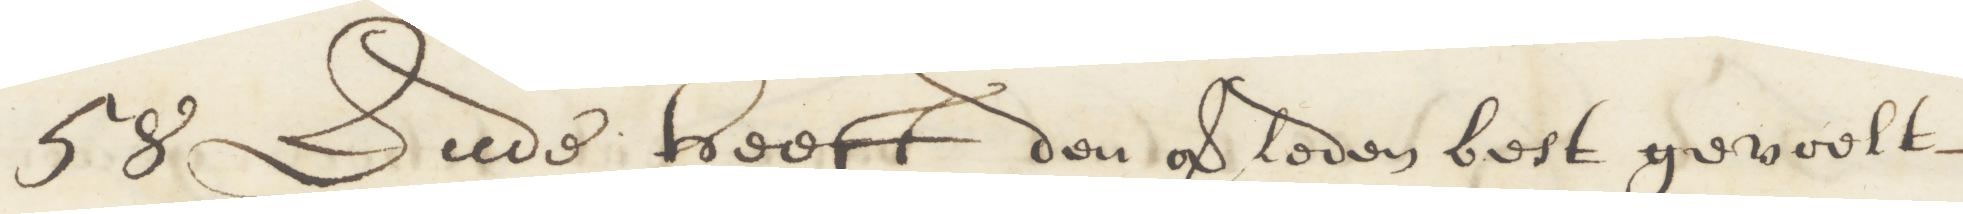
58. Ende heeft den overleden best gevoelt
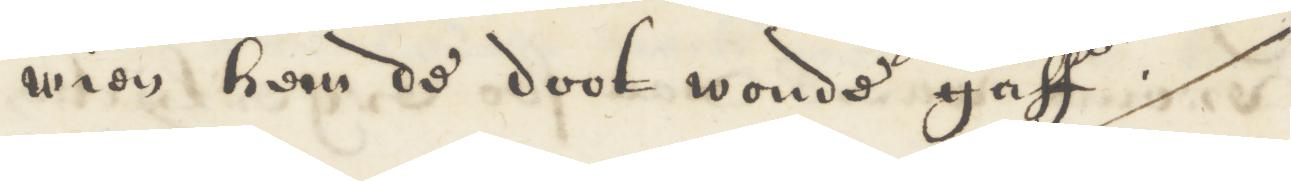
wien hem de doot wonde gaff ./
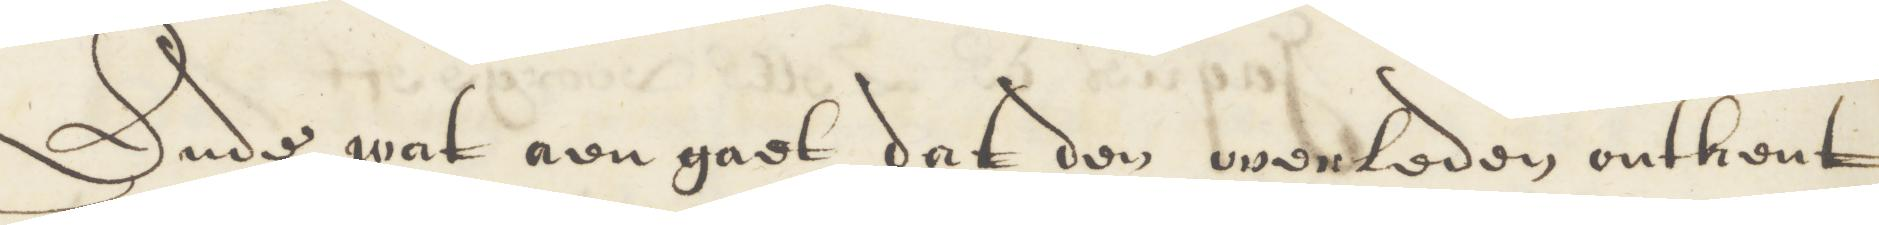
Ende wat aen gaet dat den overleden ontkent
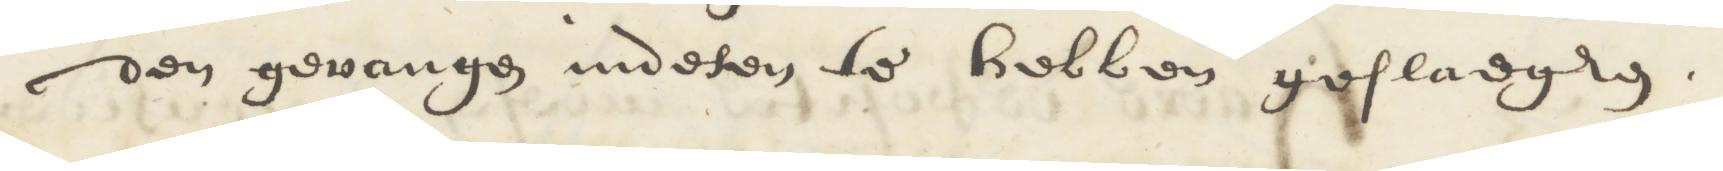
den gevangen indesen te hebben geslaeghen.
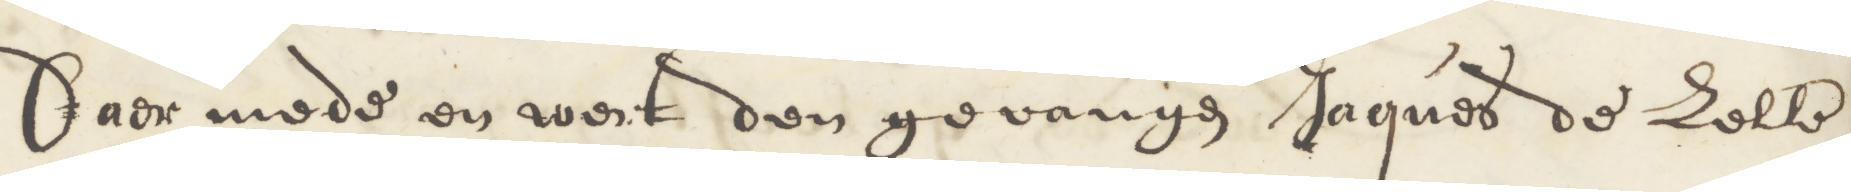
Daer mede en wert den gevangen Iaques de Zelle
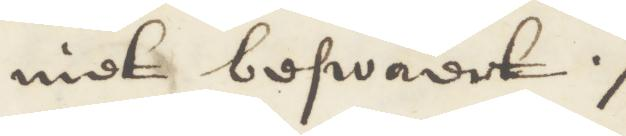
niet beswaert.
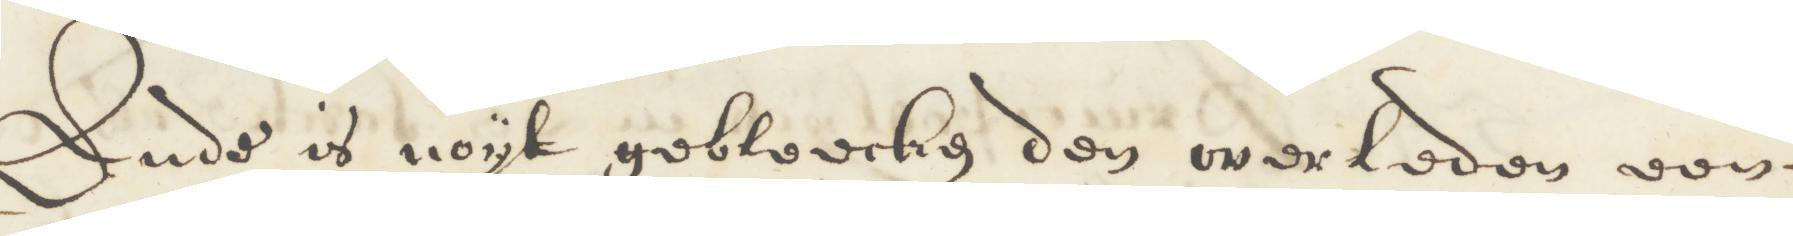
Ende is noijt gebleecken den overleden een
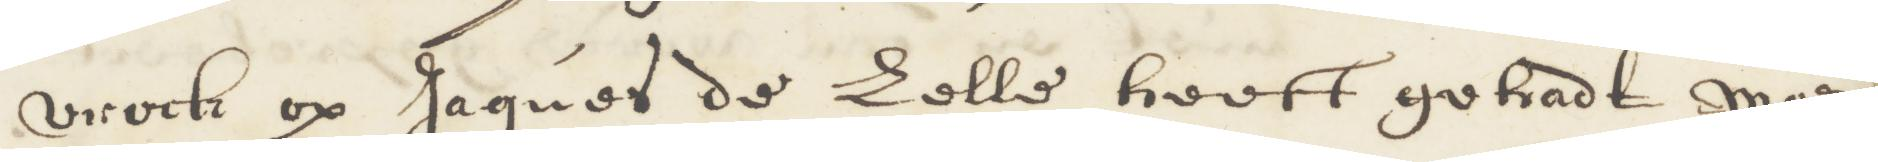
vrock op Jaques de Zelle heeft gehadt maer
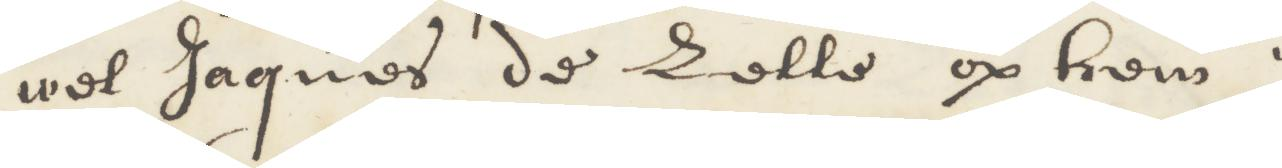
wel Jaques de Zelle op hem
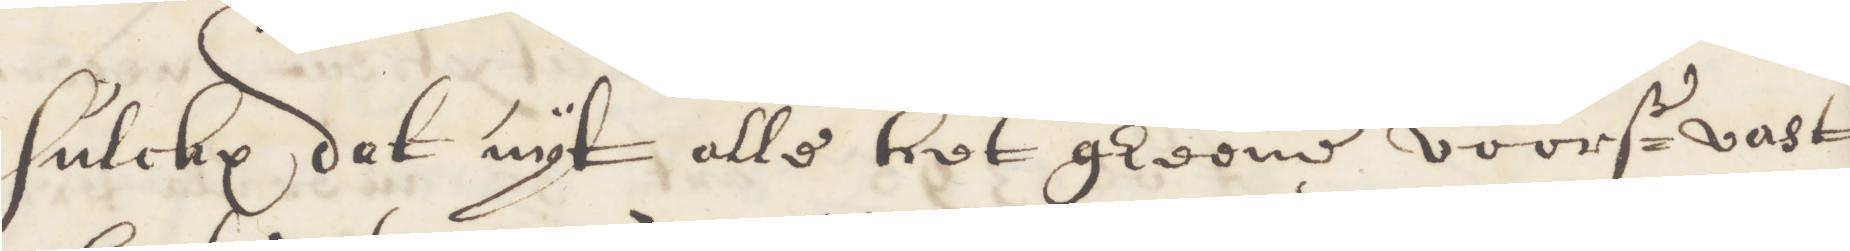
sulckx dat uijt alle het gheene voors=z vast
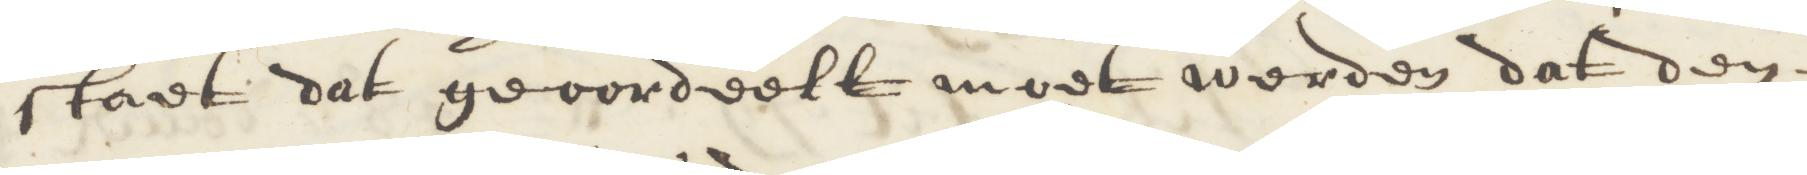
staet dat geoordeelt moet werden dat den
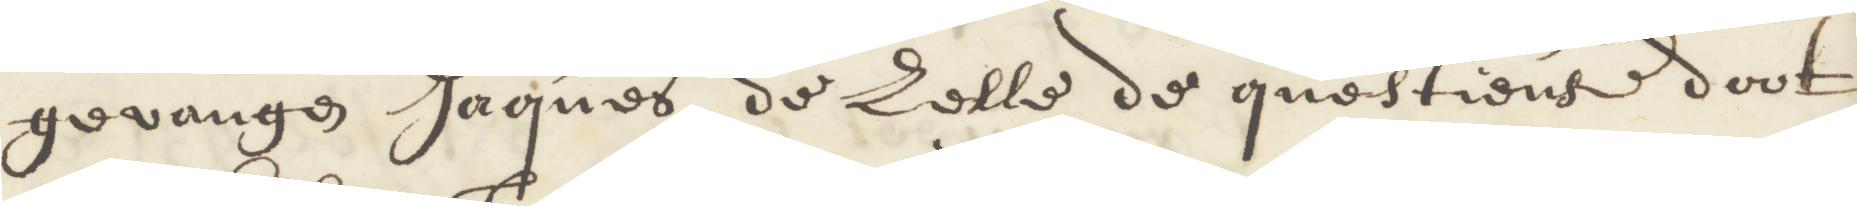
gevangen Jaques de Zelle de questieuse doot
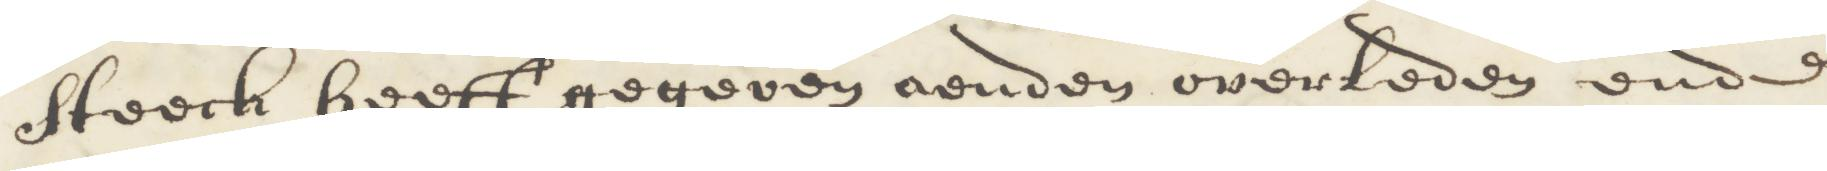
steeck heeft gegeven aenden overleden ende
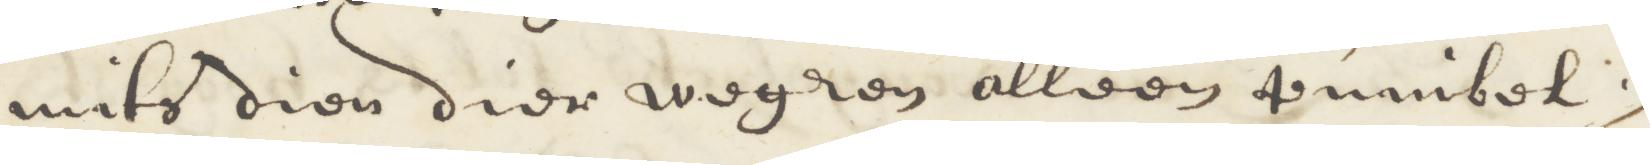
mits dien dier weghen alleen punibel.
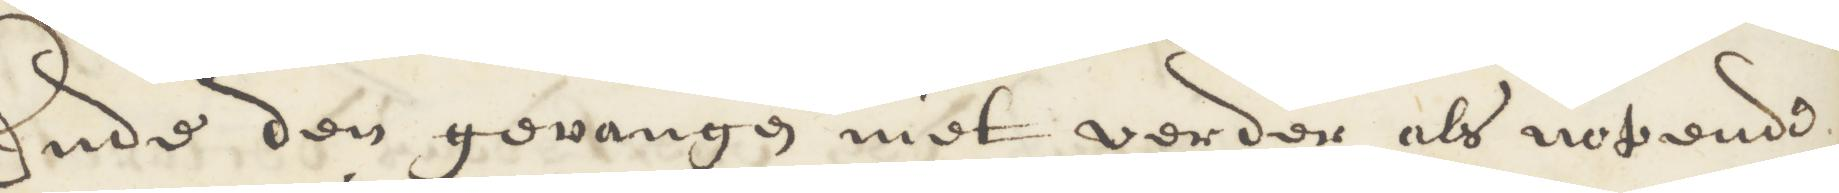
Ende den gevangen niet verder als nopende
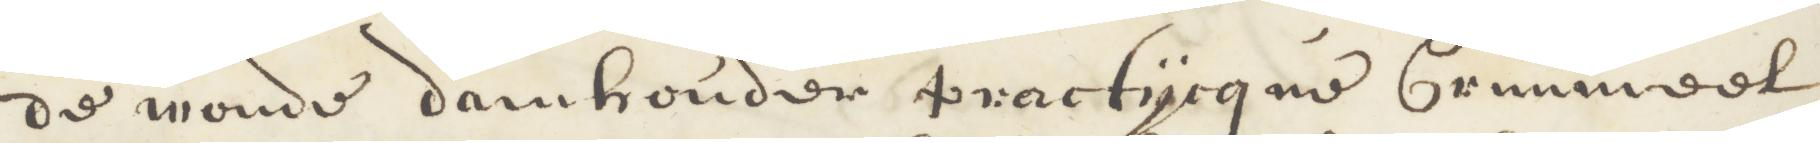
de wonde damhouder practijcque Crimineel
